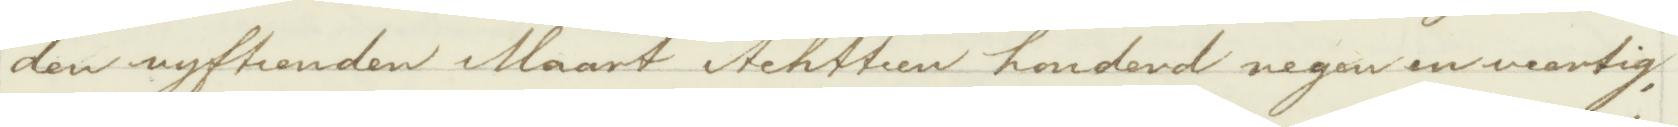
den vyftienden Maart Achttien honderd negen en veertig,
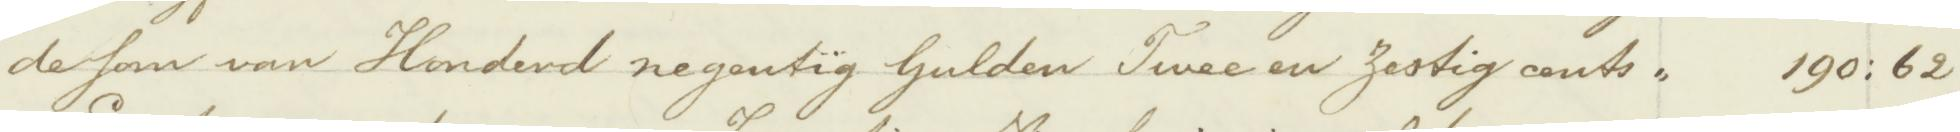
de som van Honderd negentig Gulden Twee en Zestig cents„ 190: 62
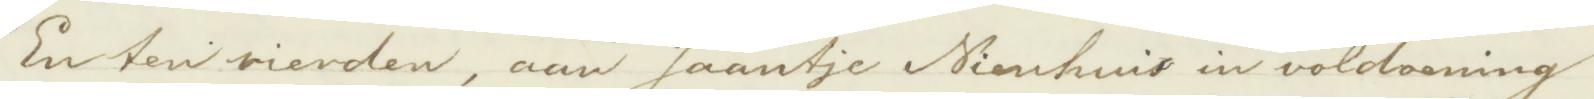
En ten vierden, aan Jaantje Nieuhuis in voldoening
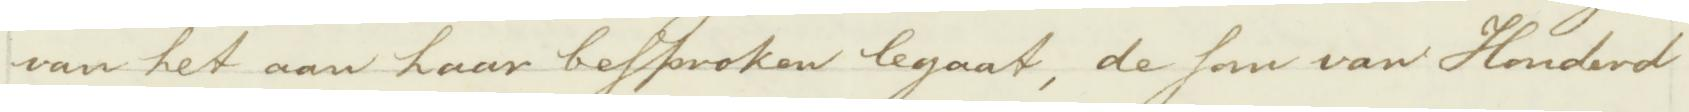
van het aan haar besproken legaat, de som van Honderd
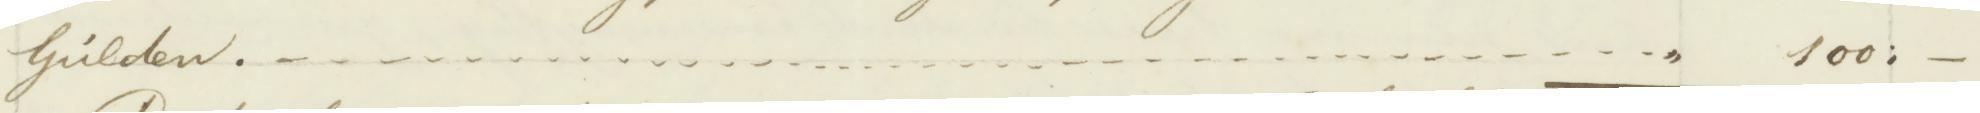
Gulden. - - - - - - - - - - - - - - - - - - - - - - - - - - - - - - - - - - - - - - „ 100: —
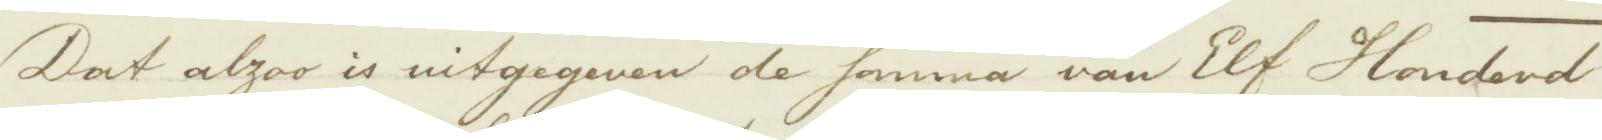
Dat alzoo is uitgegeven de somma van Elf Honderd
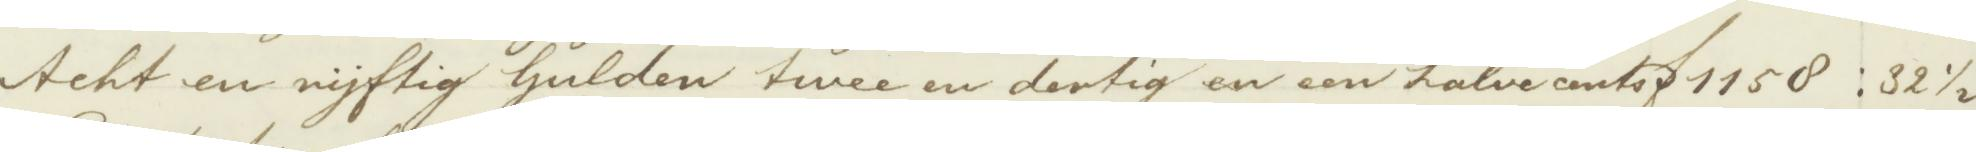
Acht en vijftig Gulden twee en dertig en een halve cents ƒ 1158: 32½
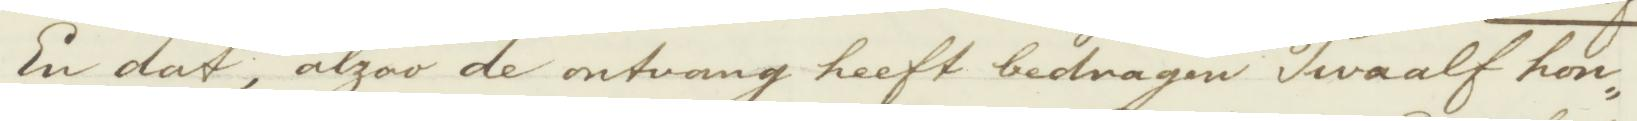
En dat, alzoo de ontvang heeft bedragen Twaalf hon„
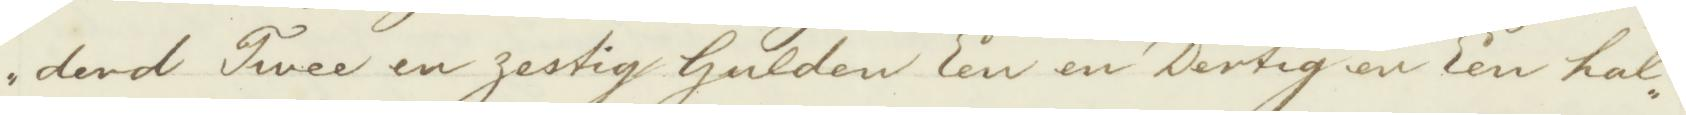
„derd Twee en zestig Gulden Een en Dertig en Een hal„
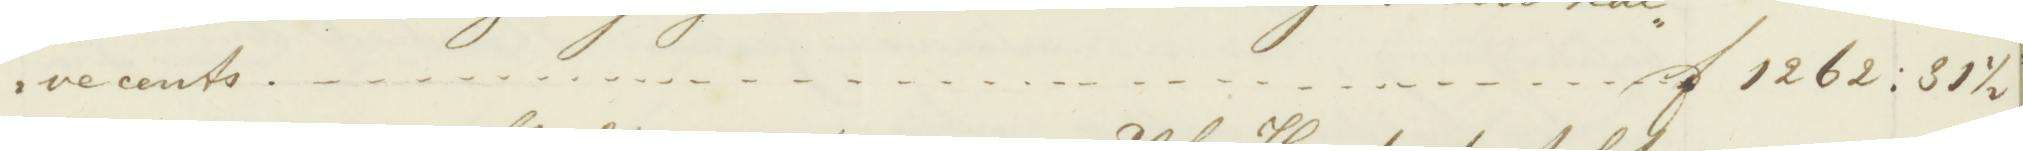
„ve cents. - - - - - - - - - - - - - - - - - - - - - - - - - - - - - - - - - - - ƒ 1262: 31½
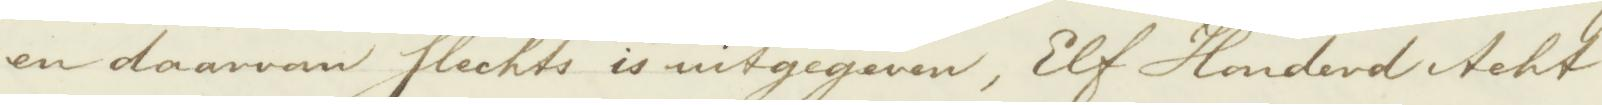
en daarvan slechts is uitgegeven, Elf Honderd Acht
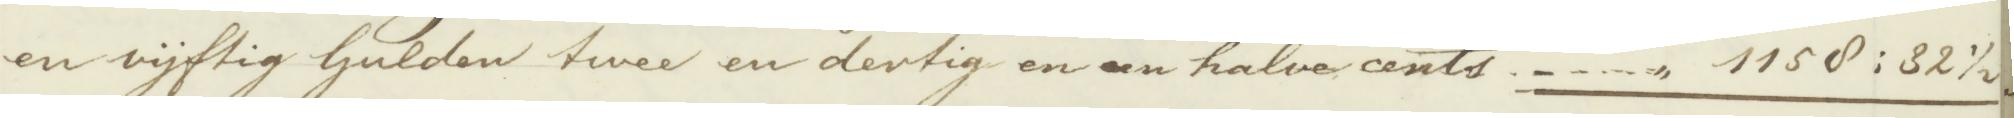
en vijftig Gulden twee en dertig en een halve cents. - - . - - -„ 1158:32½
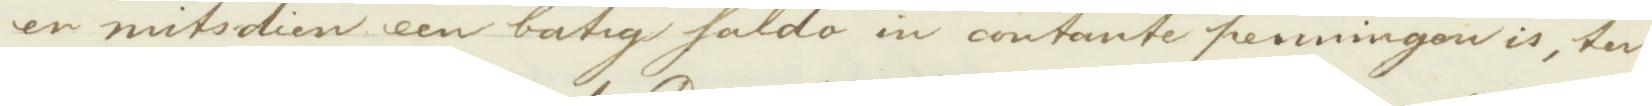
en mitsdien een batig saldo in contante penningen is, ter
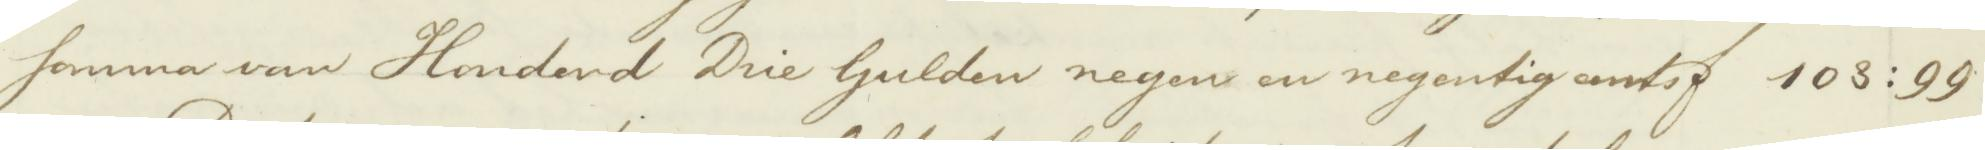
somma van Honderd Drie Gulden negen en negentig cents ƒ 103:99
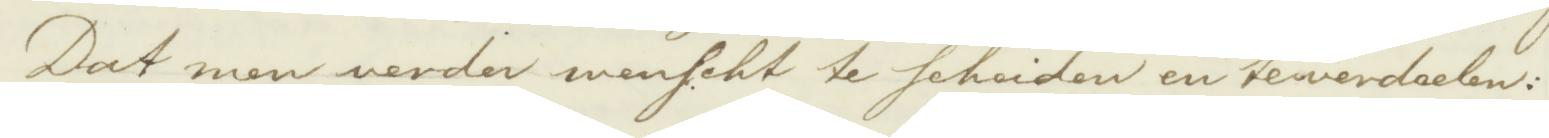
Dat men verder wenscht te scheiden en teverdeelen:
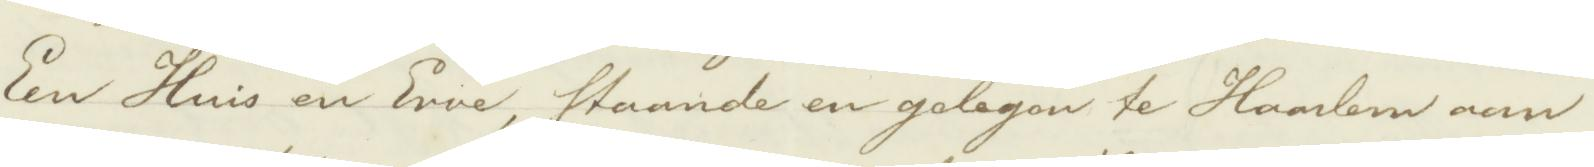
Een Huis en Erve, staande en gelegen te Haarlem aan
